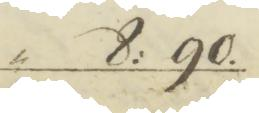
„ 8: 90.
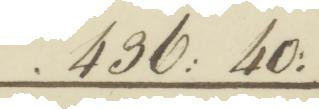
. 436: 40:
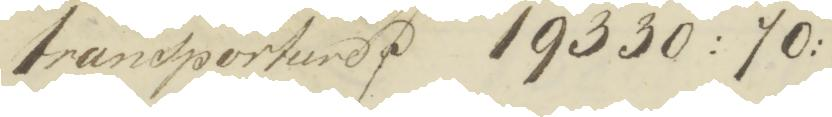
Transporteerd ƒ 19330 : 70:
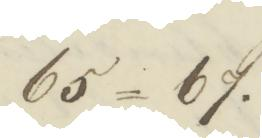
65 = 67.
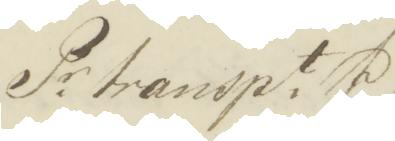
P„r transp„t ƒ
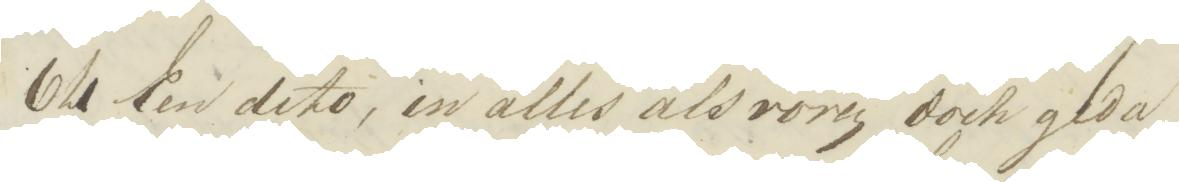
64 Een dito, in alles als voren, doch geda
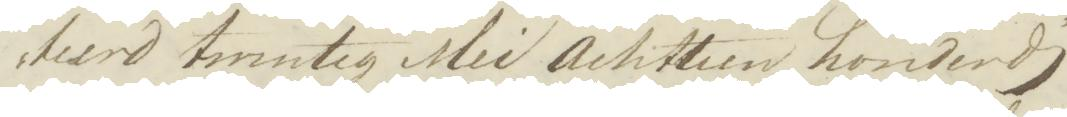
„teerd twintig Mei achttien honderd
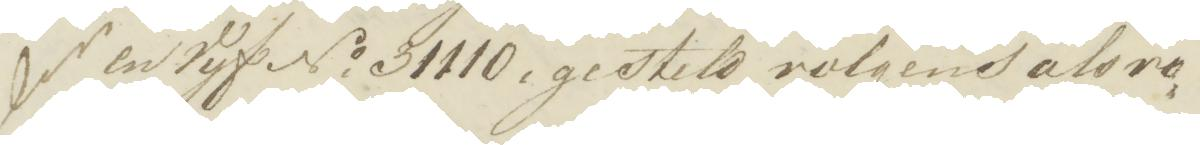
en Vyf N„o 31110, gesteld volgens als vo„
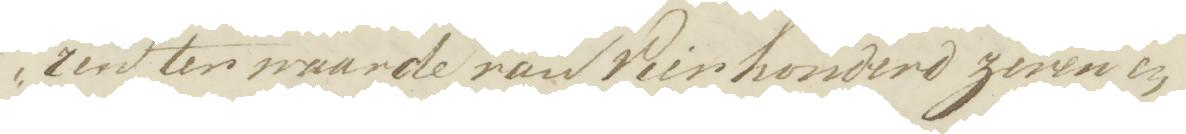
„ren ter waarde van Vierhonderd zeven en
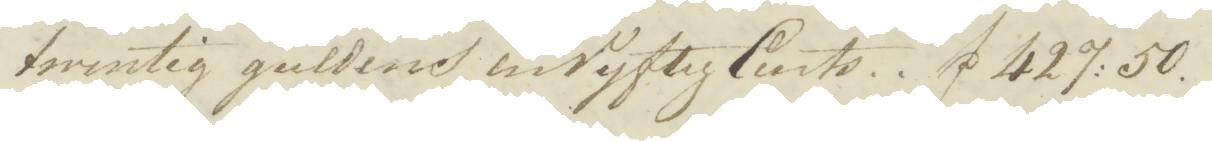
twintig guldens enVyftig Cents.. ƒ 427: 50.
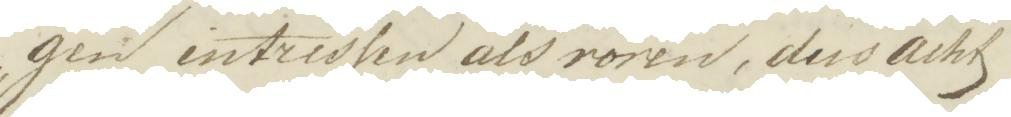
gen intressen als voren, dus Acht
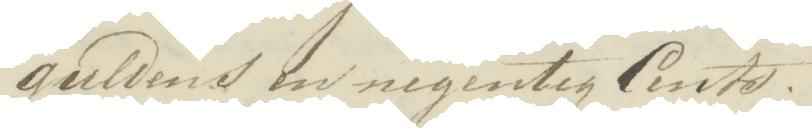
guldens en negentig Cents.
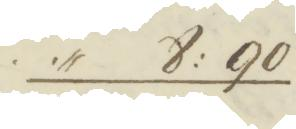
. .„ 8: 90
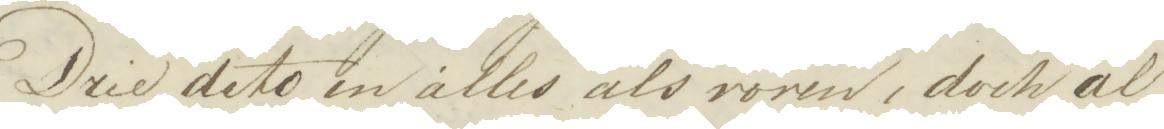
Drie dito in alles als voren, doch al
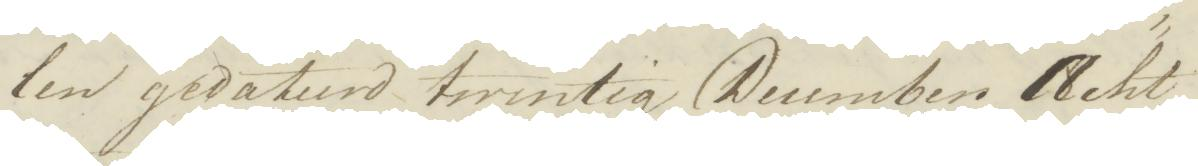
len gedateerd twintig December Acht„
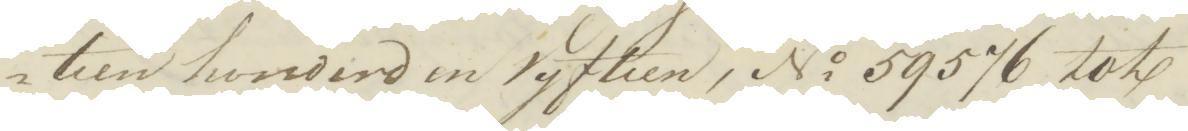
„tien honderd en Vyftien, N„o 59576 tot
